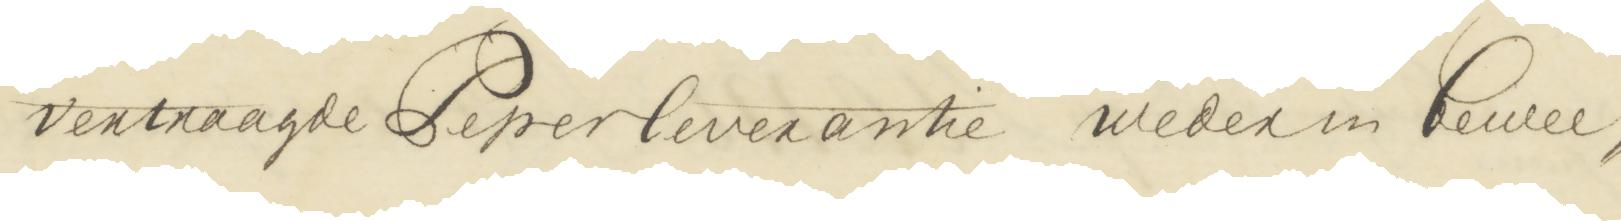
vertraagde Peperleverantie weder in bewee
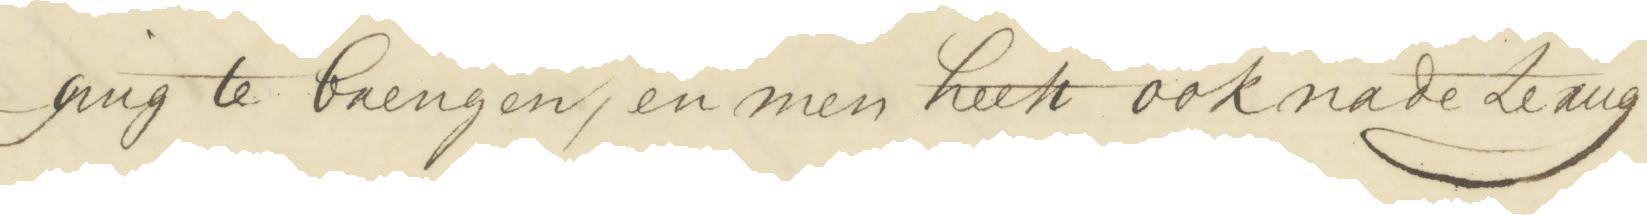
ging te brengen, en men heeft ook na de terug
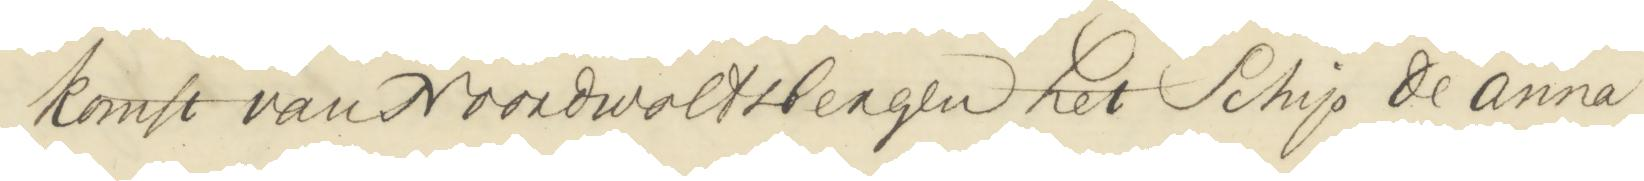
komst van Noordwoltsbergen het schip de anna
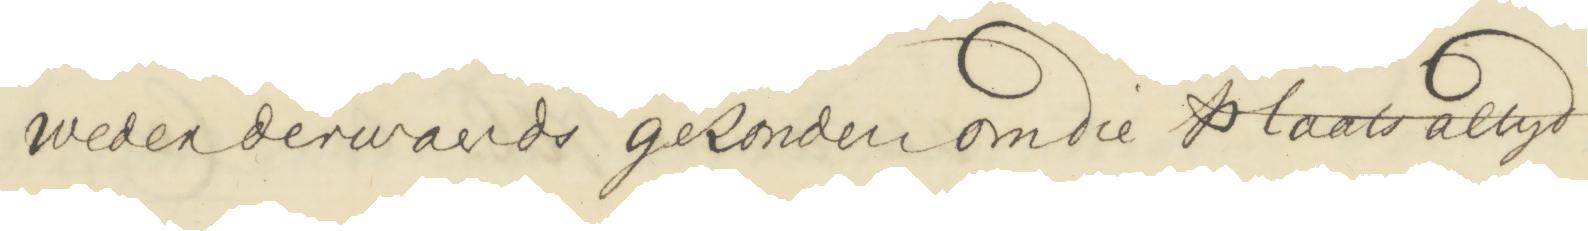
weder derwaerds gezonden om die plaats altijd
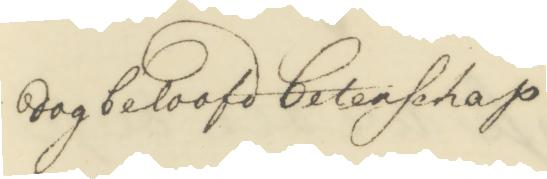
dog beloofd beterschap
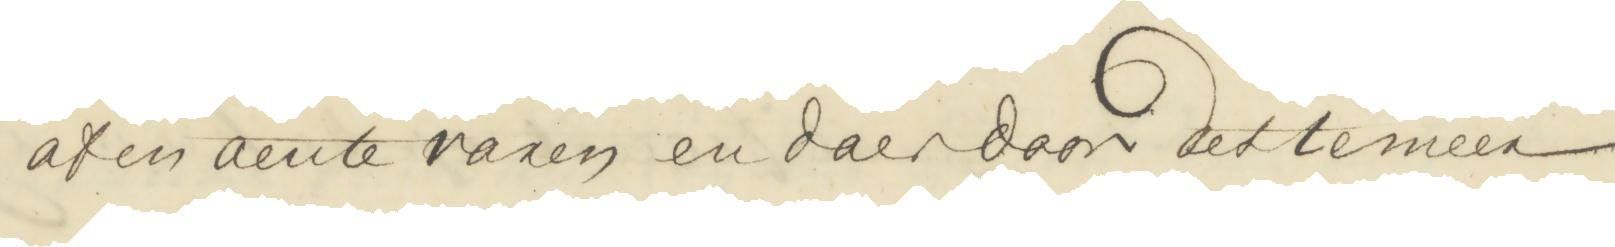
af en aente varen en daerdoor destemeer
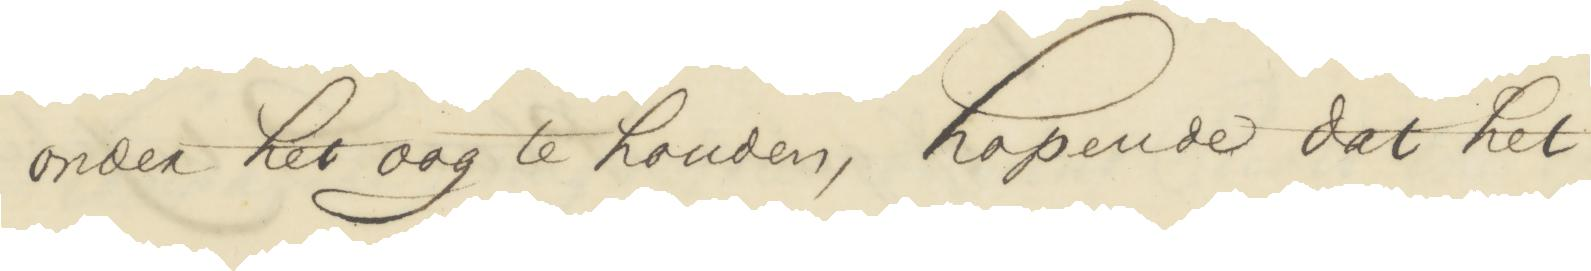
onder het oog te houden, hopende dat het
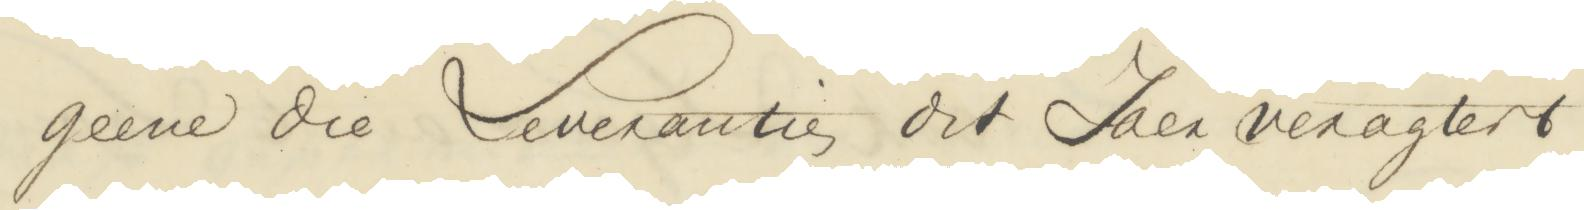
geene die Leveranties dit Iaer veragtert
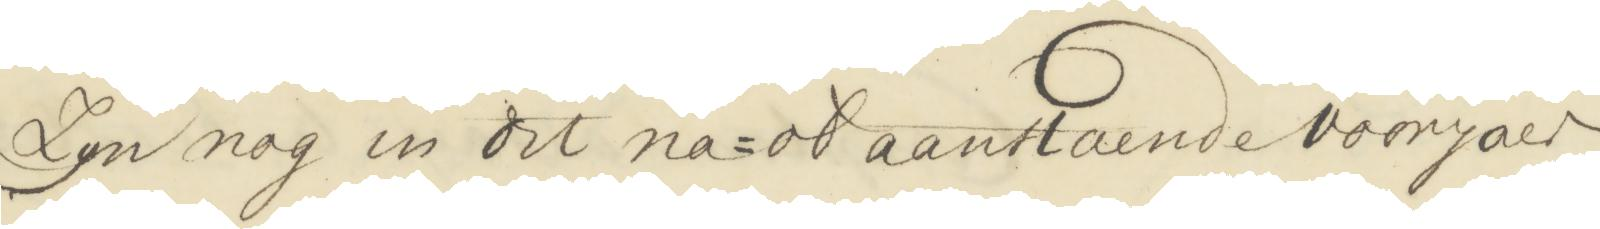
Zyn nog in dit na=of aanstaende voorjaer
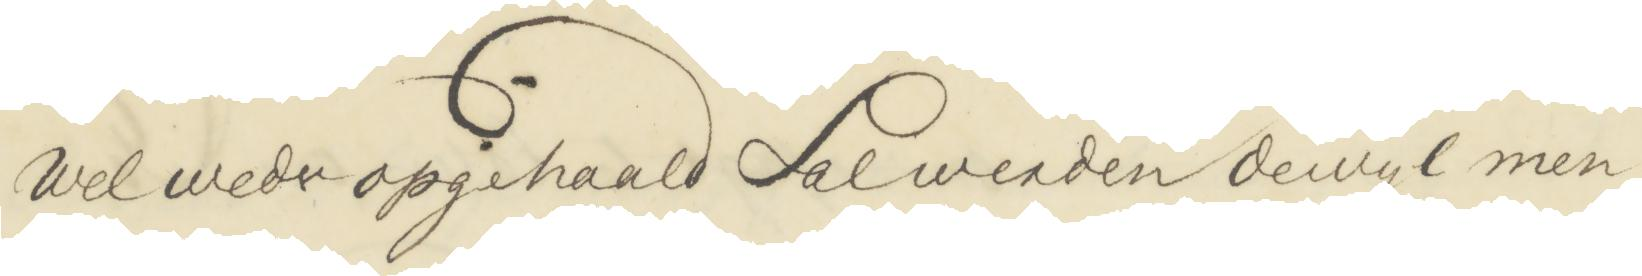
wel weder opgehaald Sal werden dewyl men
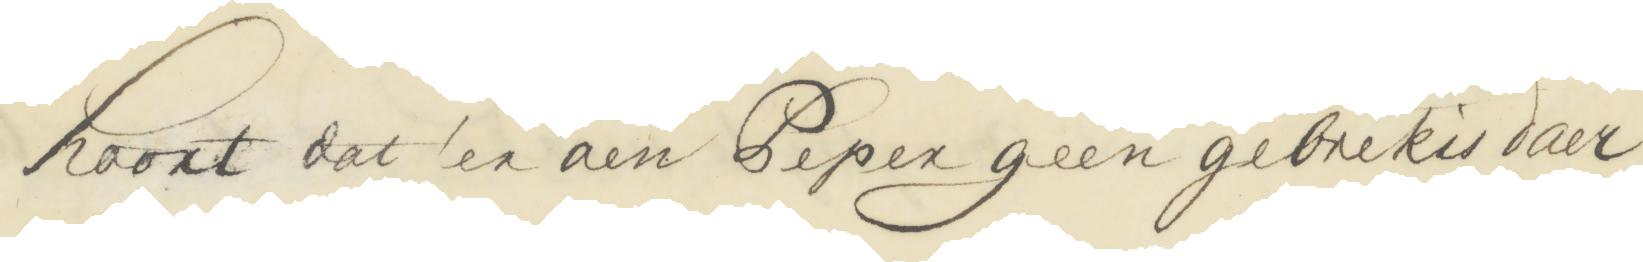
hoort dat 'er aen Peper geen gebrekis daer
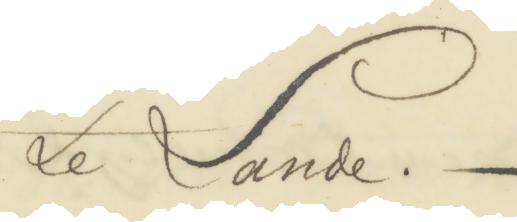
te Lande.—
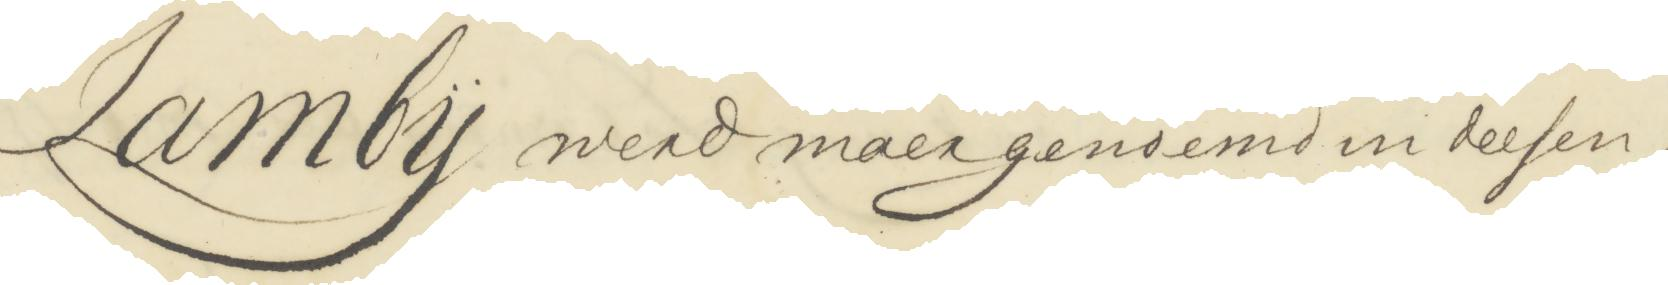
Iambij werd maer genoemd in deesen,
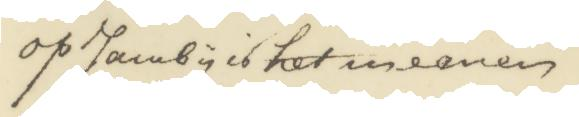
op Jambij is het in eenen
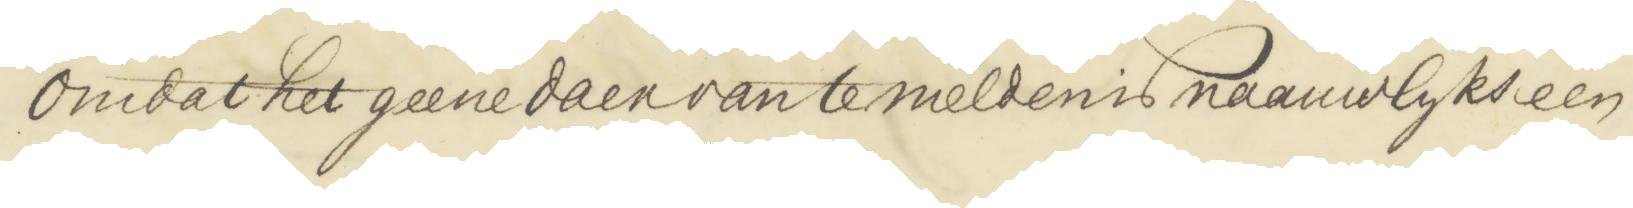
omdat het geene daer van te melden is naauwlyks een
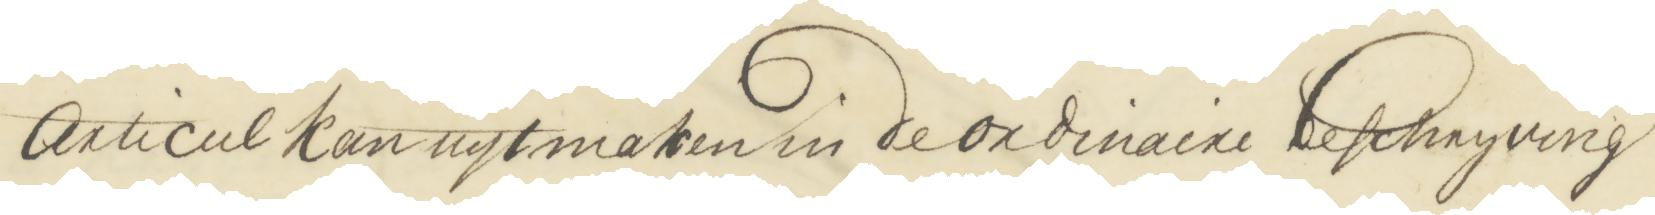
articul kan uytmaken in de ordinaire beschryving
